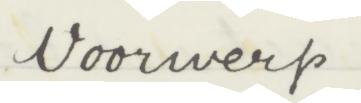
Voorwerp
